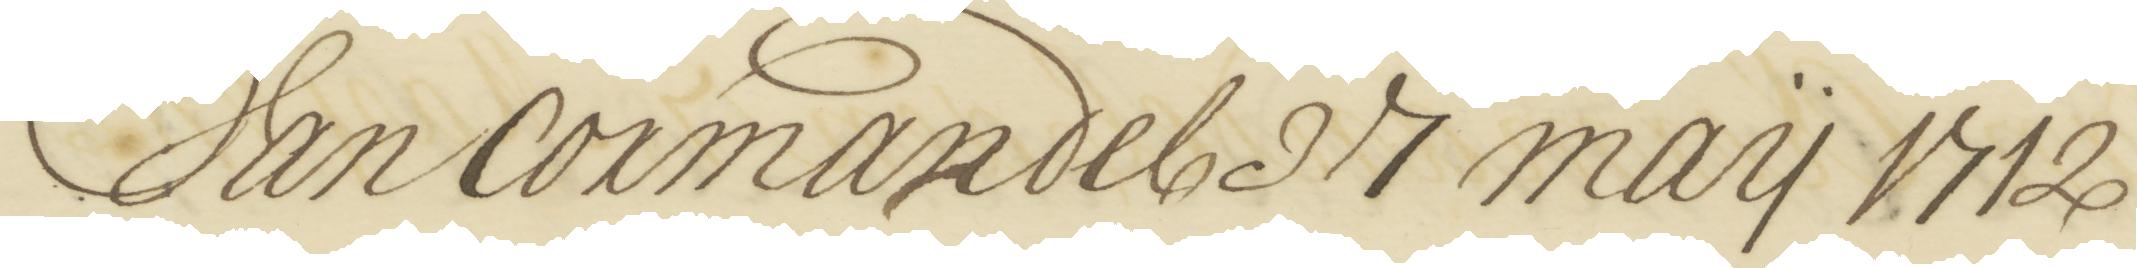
Van Cormandel d 7 maij 1712
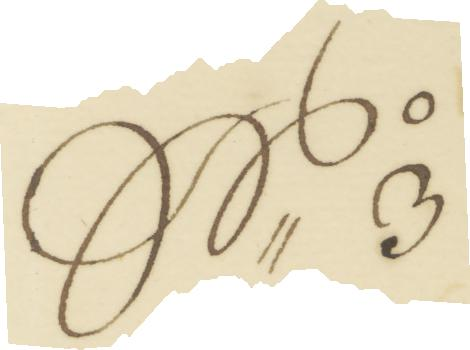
N„o 3
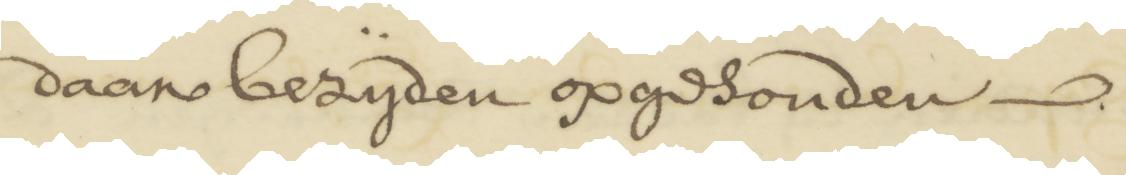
daar bezijden opgesonden.
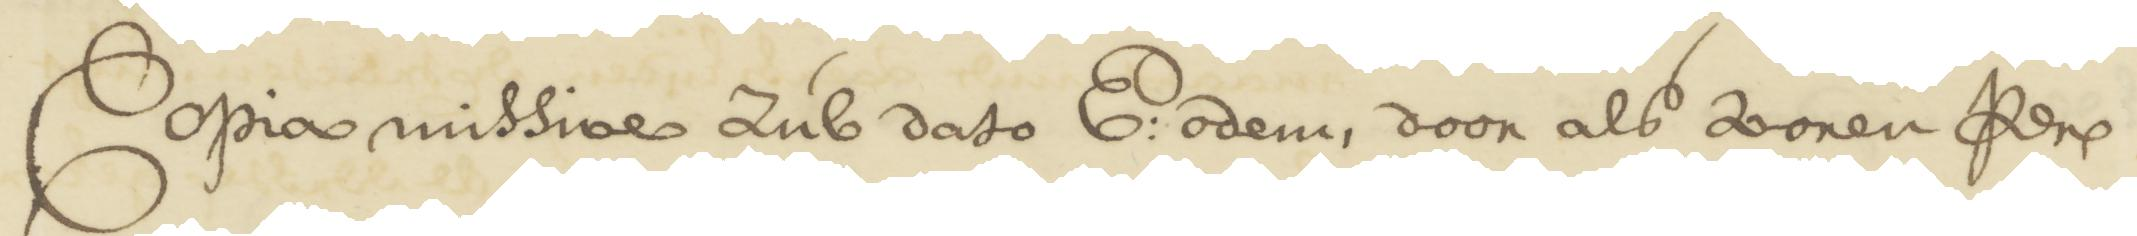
Copia missive zul dato E: odem, door als voren per
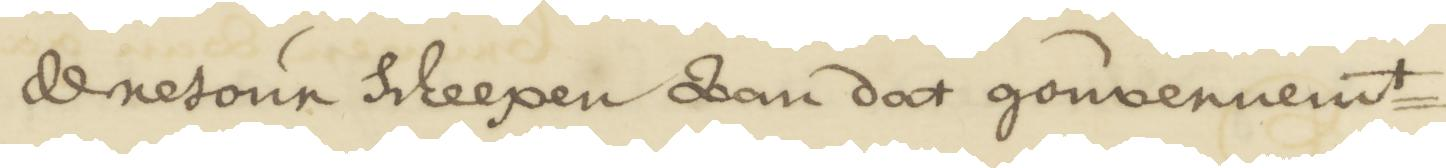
de retour scheepen van dat gouvernem=t
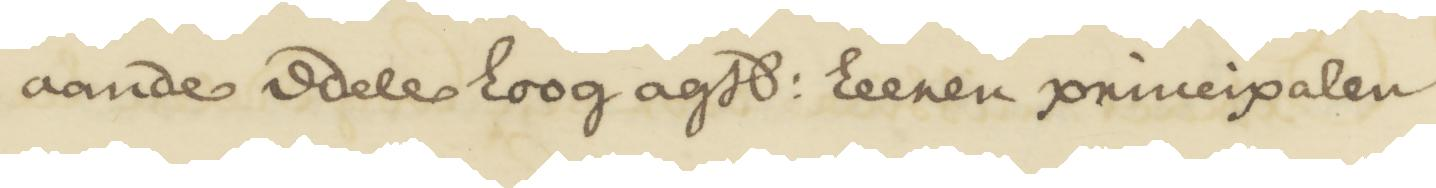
aande Edele hoog agtb: heeren principalen
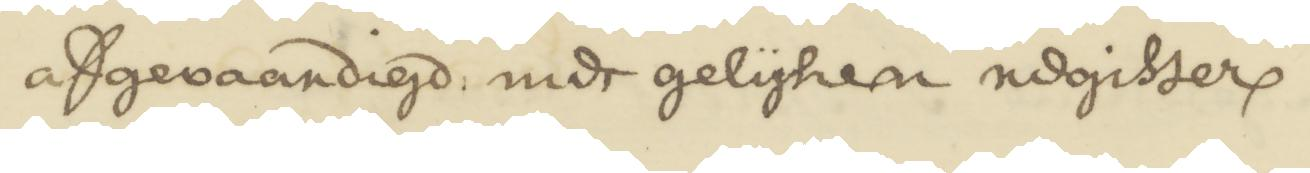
afgevaardigd: met gelijken register
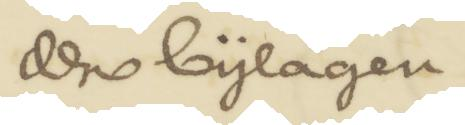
der bijlagen
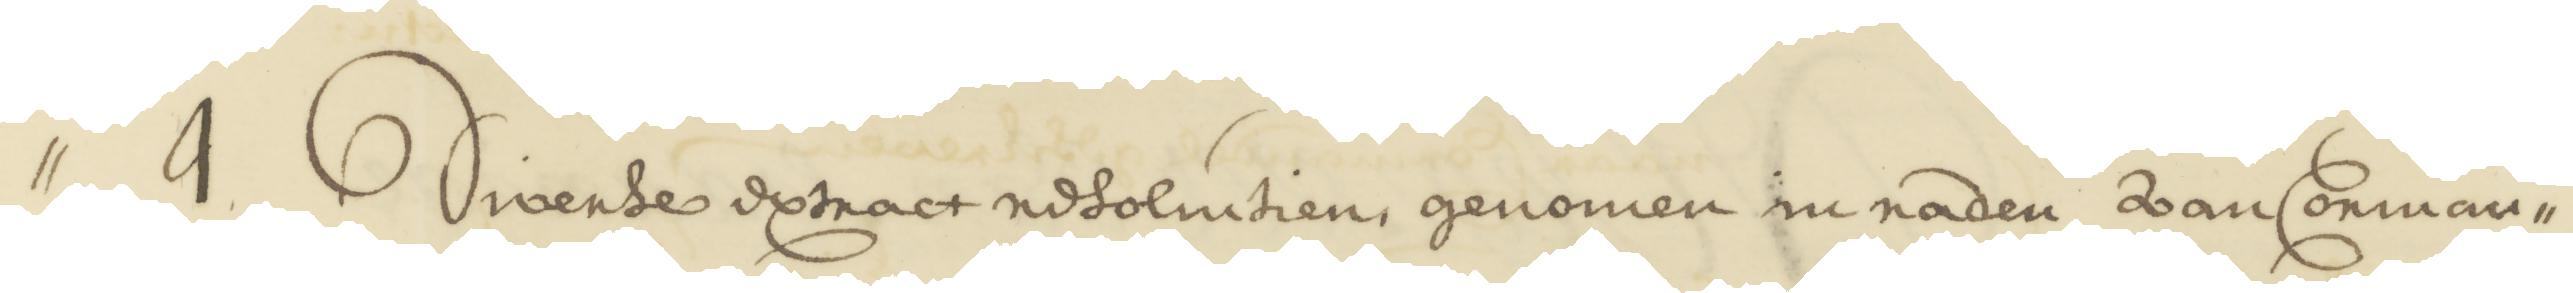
„ 4. diverse extract resoluitien, genomen in raden van Corman„
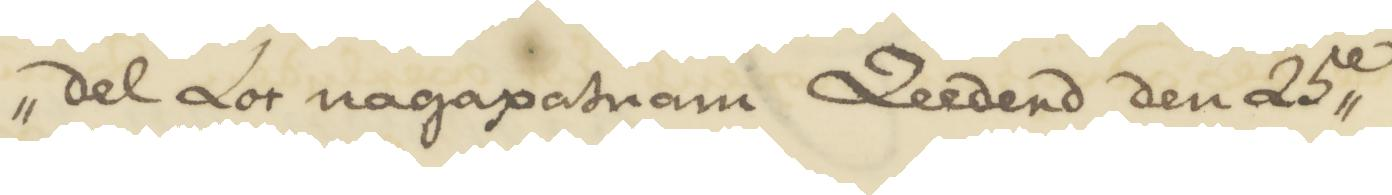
„del tot nagapatnam zeederd den 25„e
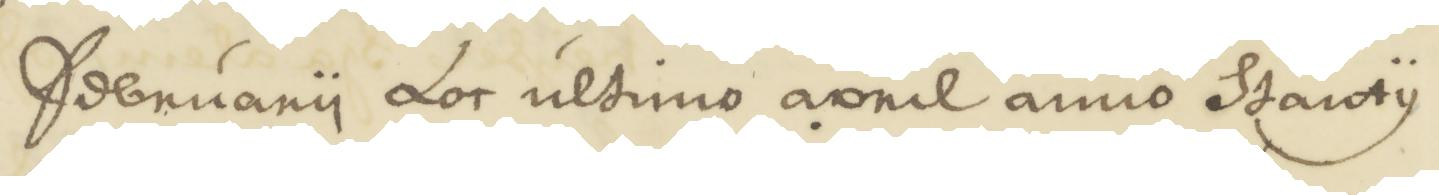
februarij tot ultimo april anno stantij
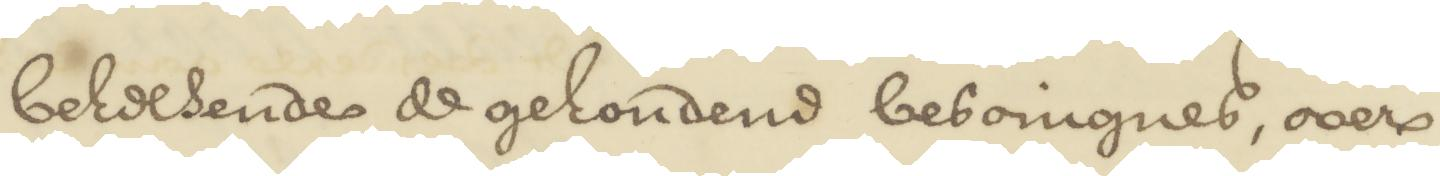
behelsende de gehoudene besoingnes, over
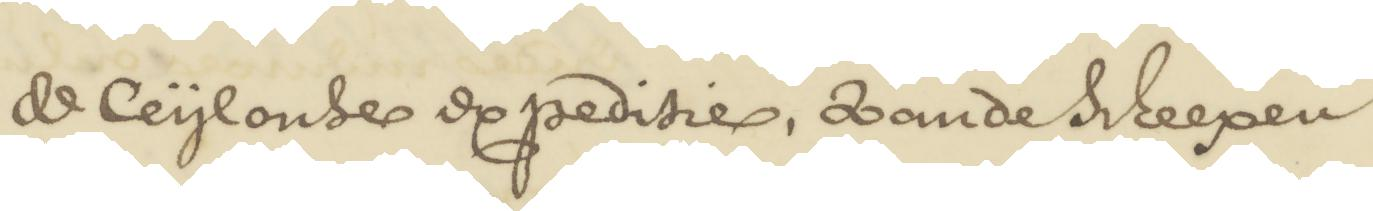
de Ceijlonse expeditie, van de scheepen
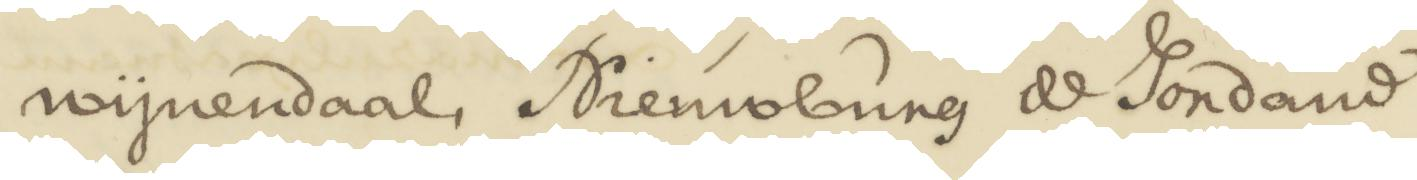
wijnendaal, Nieuwburg de Iordane
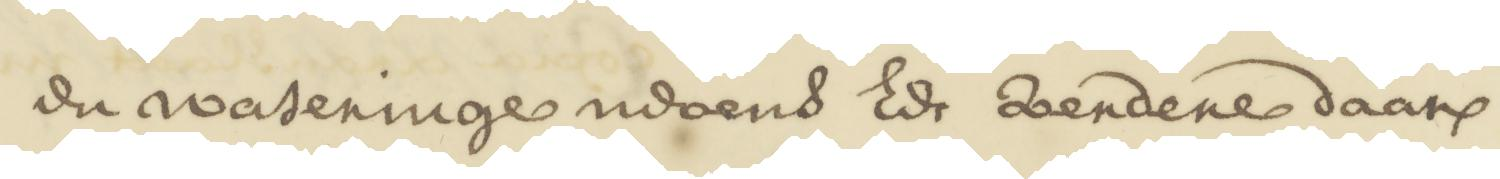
en wateringe nevens het verdere daar
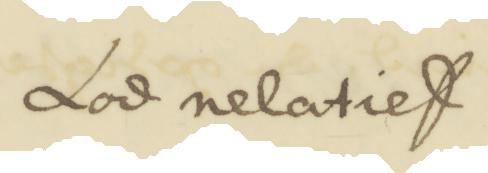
toe relatief
